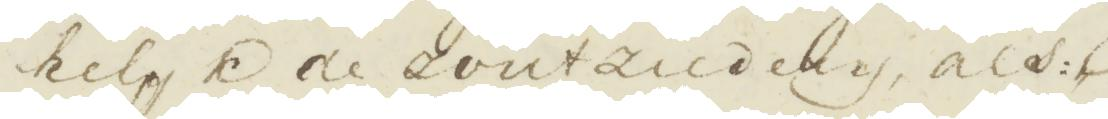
kelyk de zoutziedery, als:
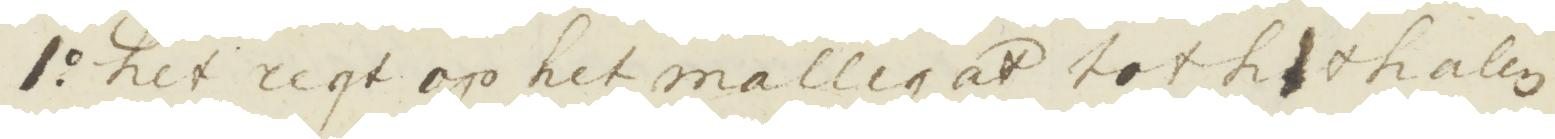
1.o het regt op het mallegat tot het halen
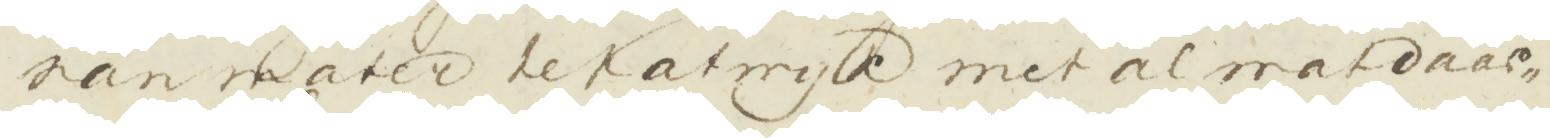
van water te Katwyk met al wat daar„
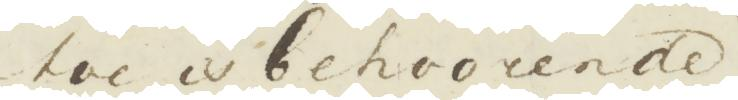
„toe is behoorende
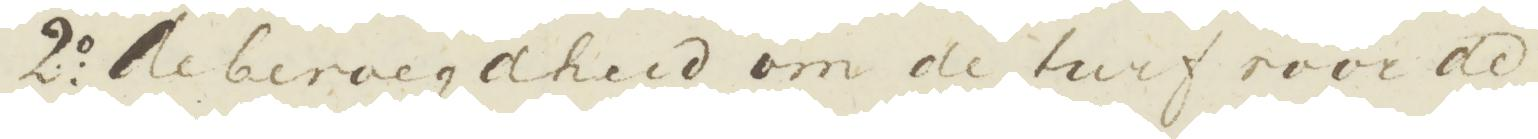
2:o de bevoegdheid om de turf voor de
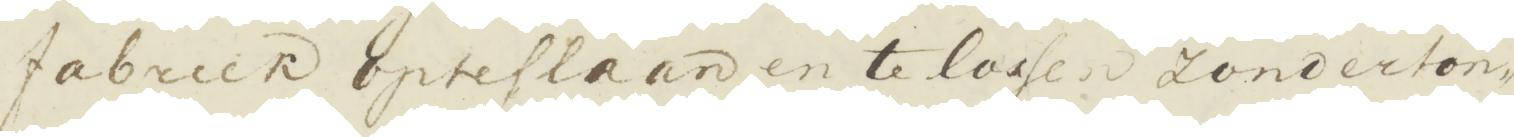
fabriek op te slaan en te lossen zonder ton„
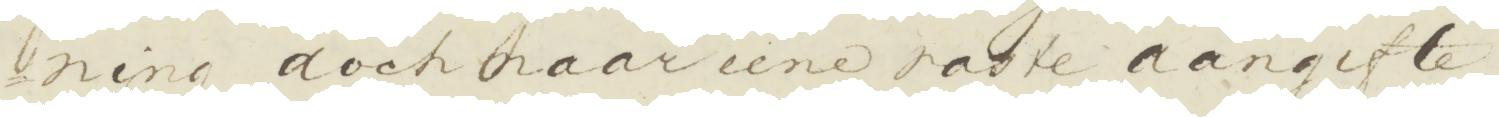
„ning doch naar eene vaste aangifte
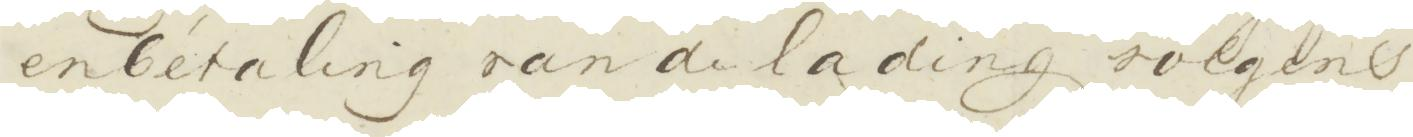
en betaling van de lading volgens
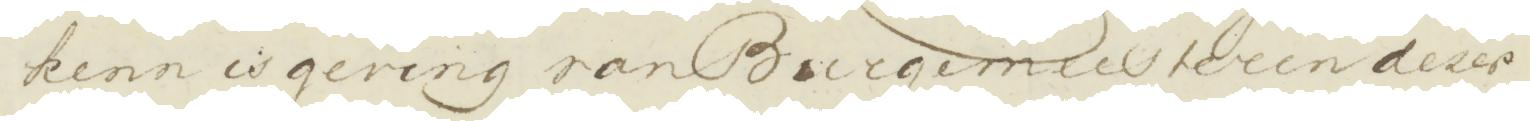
kennisgeving van Burgemeesteren dezer
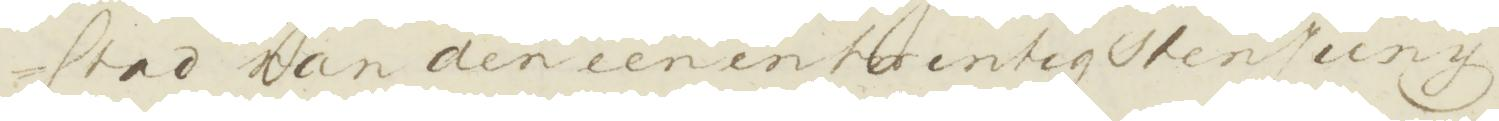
Stad van den een en twintigsten Juny
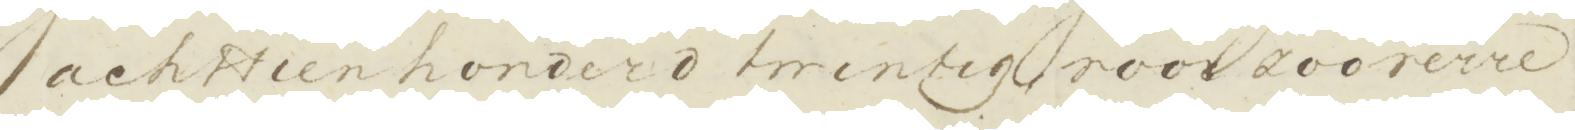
achttien honderd twintig voor zoo verre
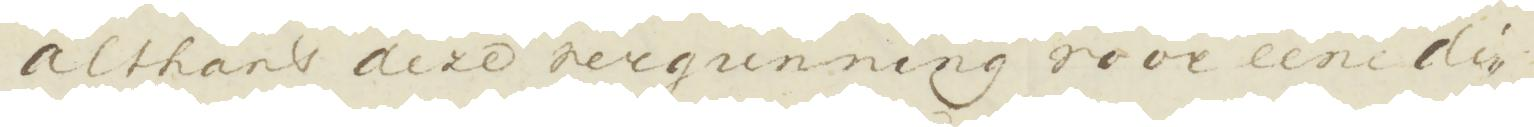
althans deze vergunning voor eene di„
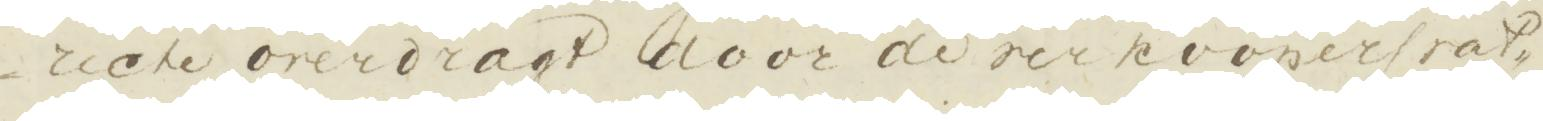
=recte overdragt door de verkooper vat„
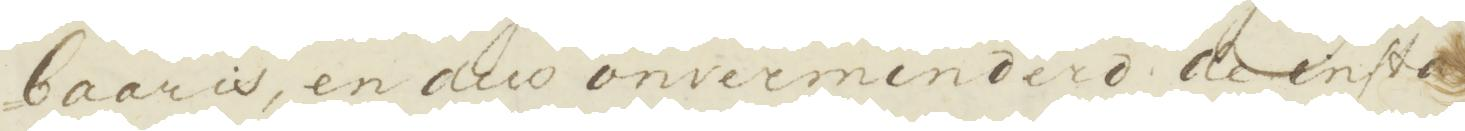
„baar is, en dus onverminderd de instan„
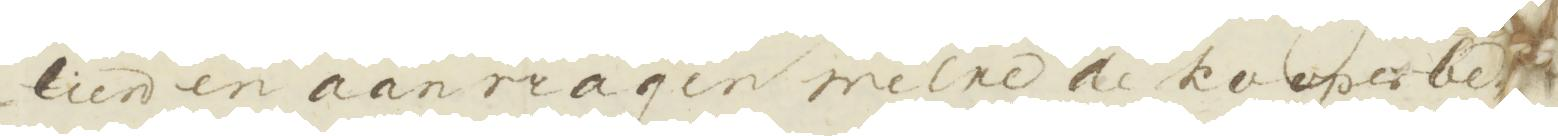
„tien en aanvragen welke de kooper be„
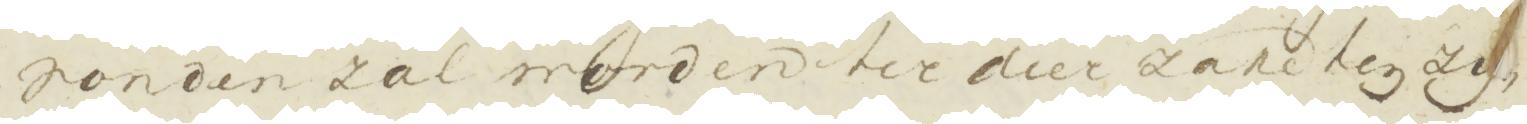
vonden zal worden ter dier zake ten zy„
